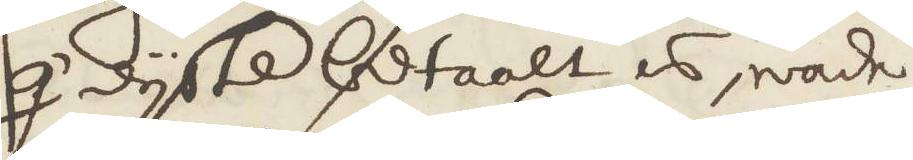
g’eijste betaalt is, noch
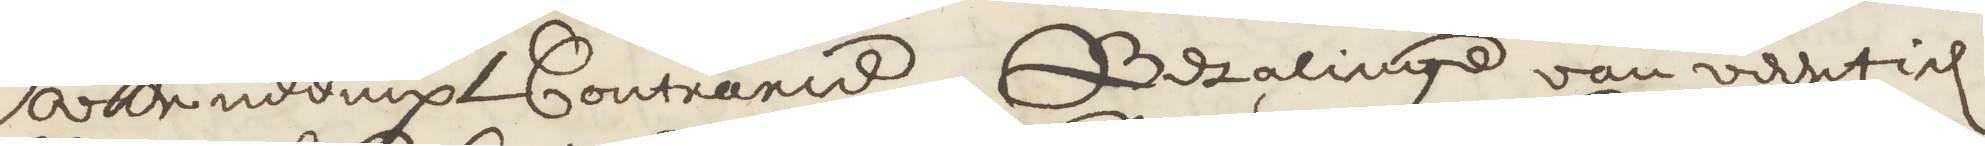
over neempt Contrarie Betalinge van veertich
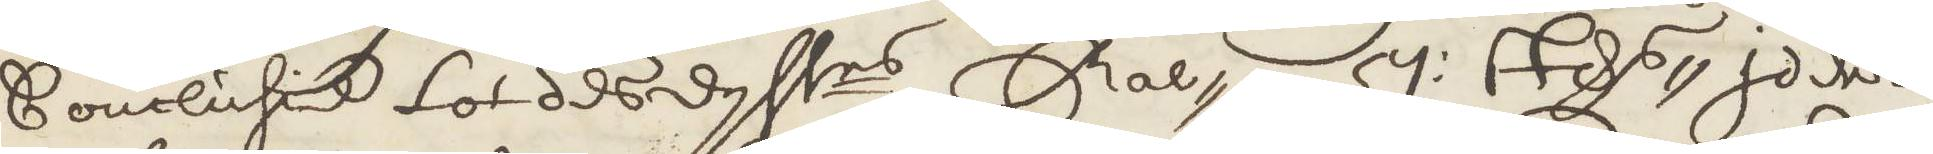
Conclusie tot des eyss=rs Ral„ 51: stvers jder
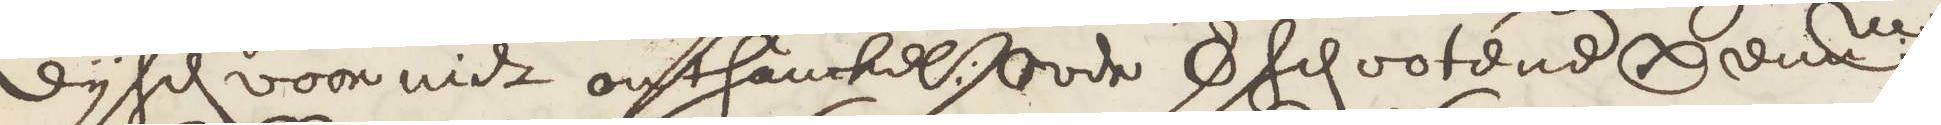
eijsch voor niet ontfanckelijk over verschootene penn:e
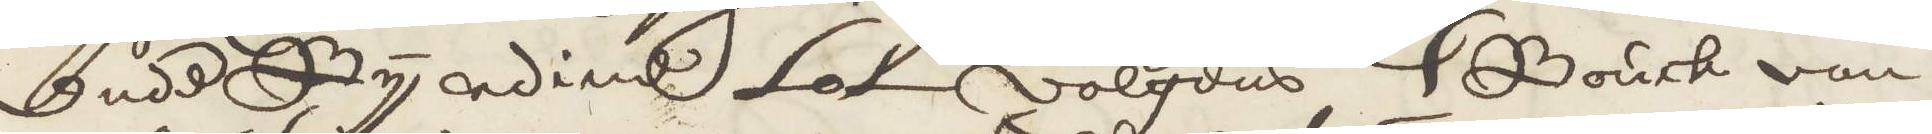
ende Bij ordine tot volgens 't Bouck van
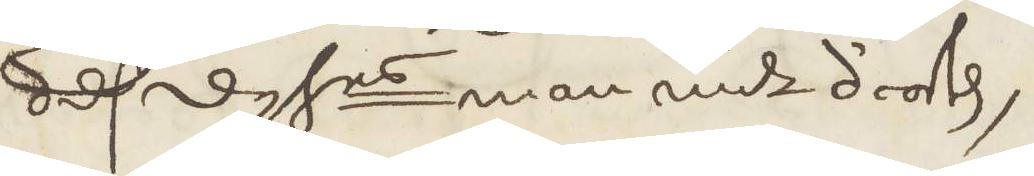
des Eys=rs man met d' costen,
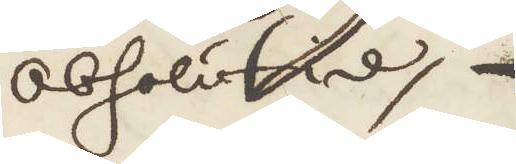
absolitie,
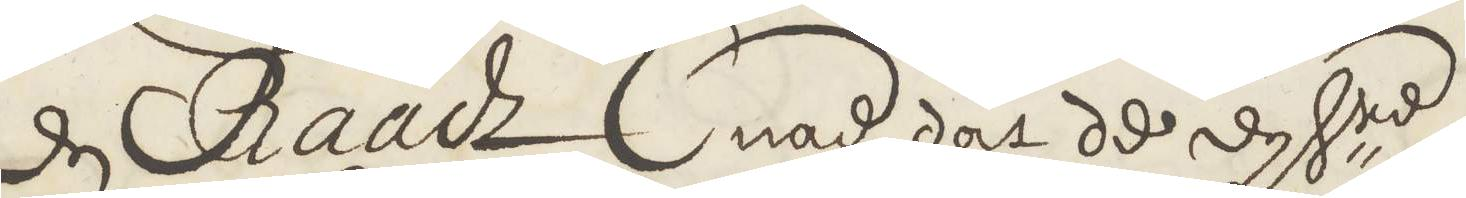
Den Raadt ( nae dat de eys„ce
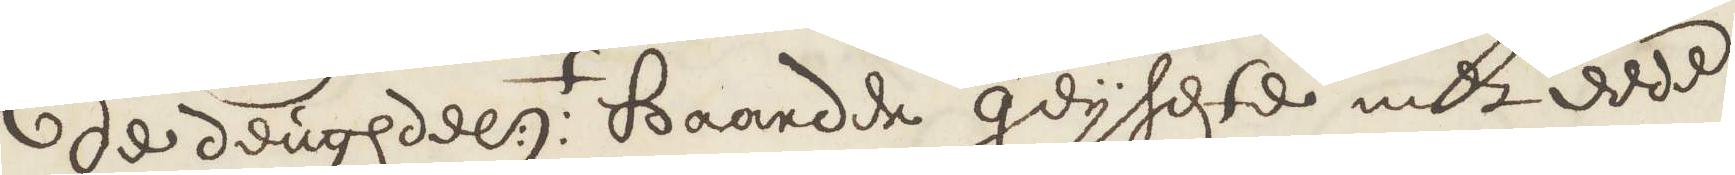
de deughdelijk:t haar der geijschte met eede
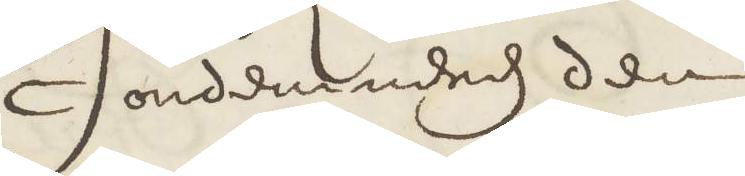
condemneren den
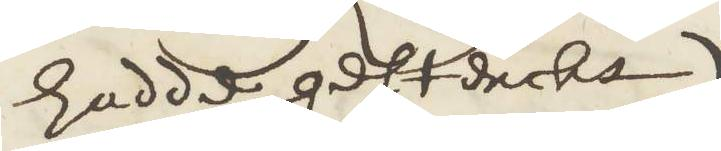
hadde gesterckt
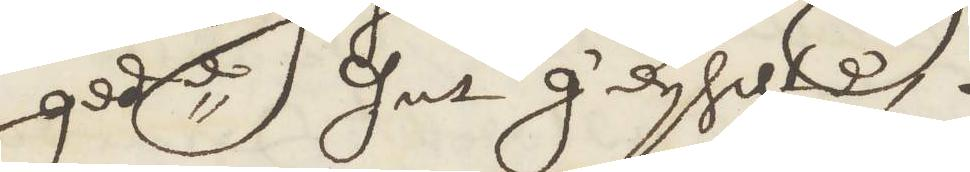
ged„e Jnt g’eyschte,
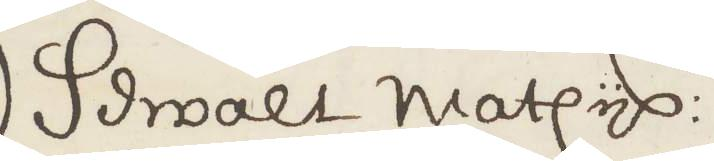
Osewalt mathijs:
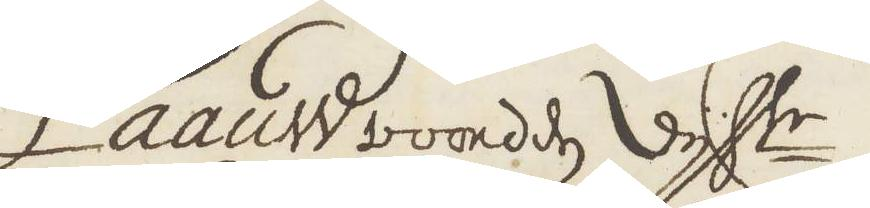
Paauw voorden eijs=sr
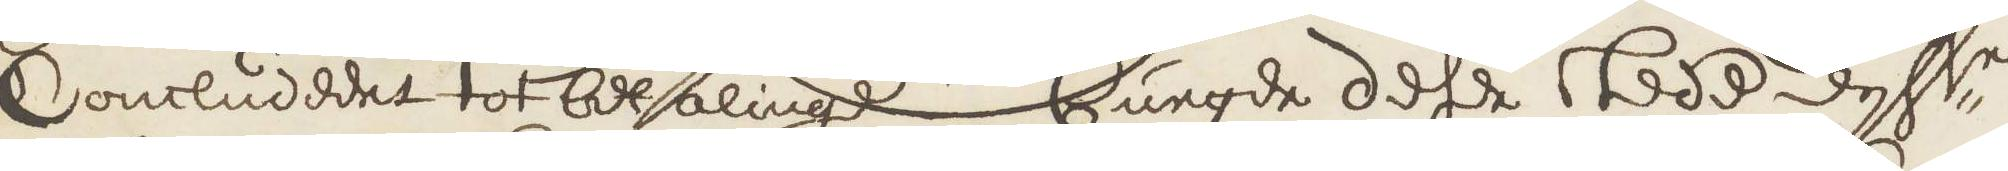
Concludeert tot betalinge burger deser stede eijss„r
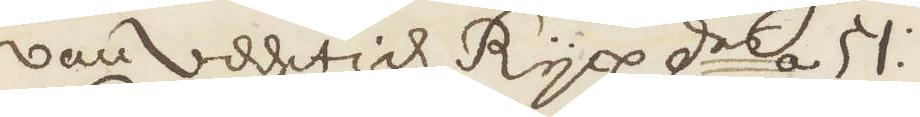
van veertich Rijcxd=rs a 51:
